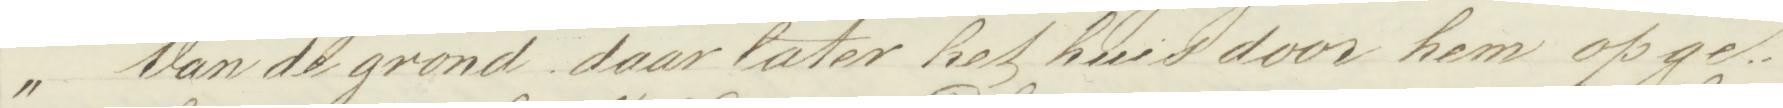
„ van de grond daar later het huis door hem op ge„
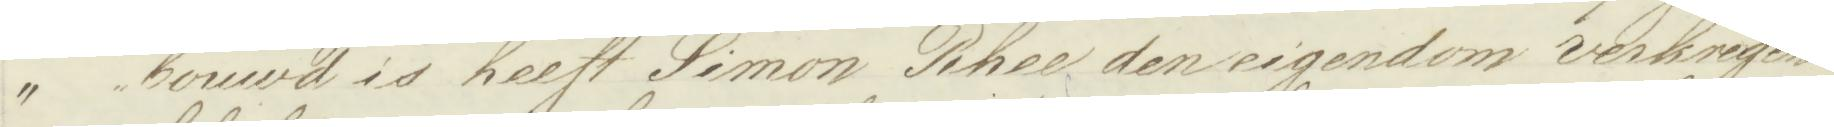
„ bouwd is heeft Simon Rhee den eigendom verkregen
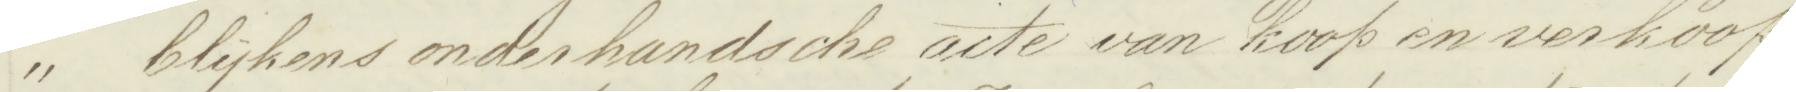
„ blijkens onderhandsche acte van koop en verkoop
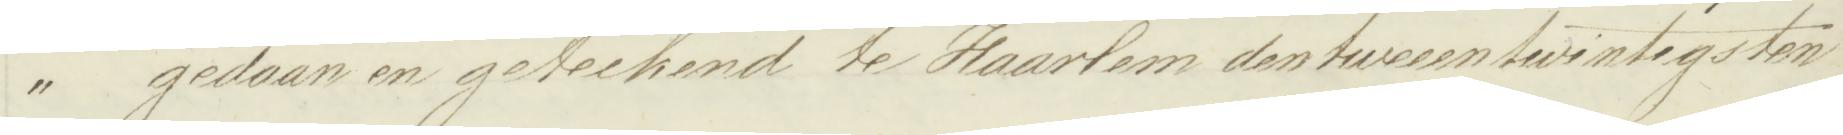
„ gedaan en geteekend te Haarlem den twee en twintigsten
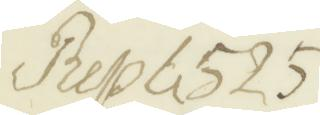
Rep 4525
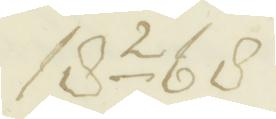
18 2/1 68
